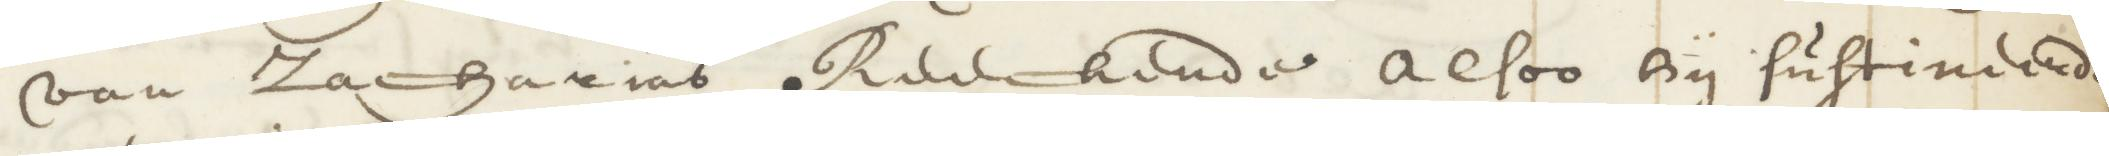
van Zacharias Reeckende alsoo hij sustineerde
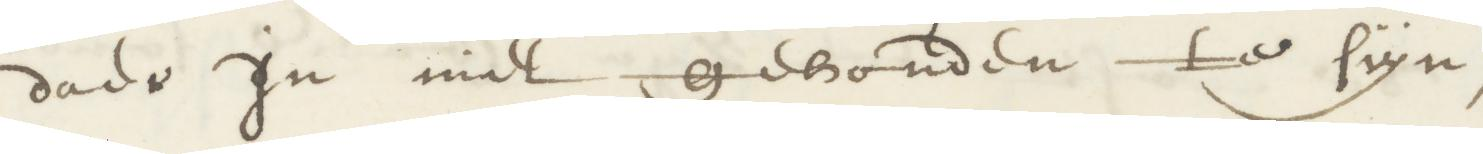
daer jn niet gehouden te sijn
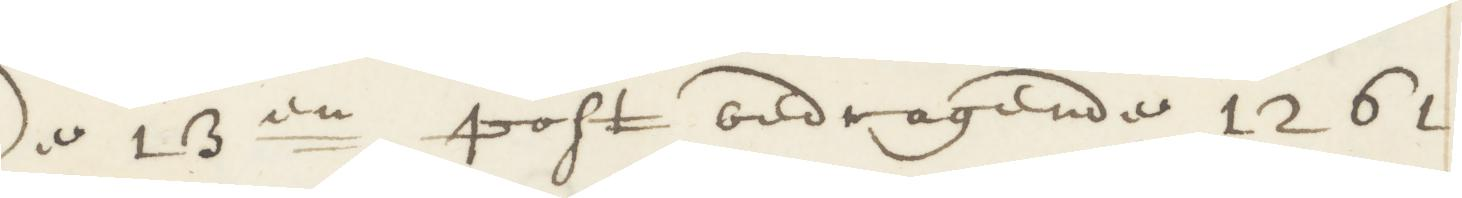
De 13=en post bedragende 1261
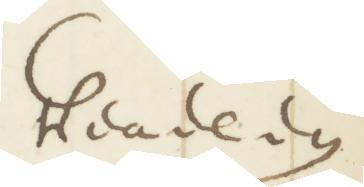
Reaelen
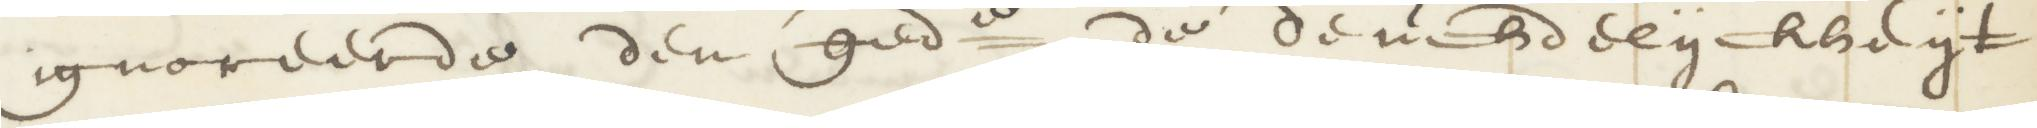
ignoreerde den ged=e de deuchdelijckheijt
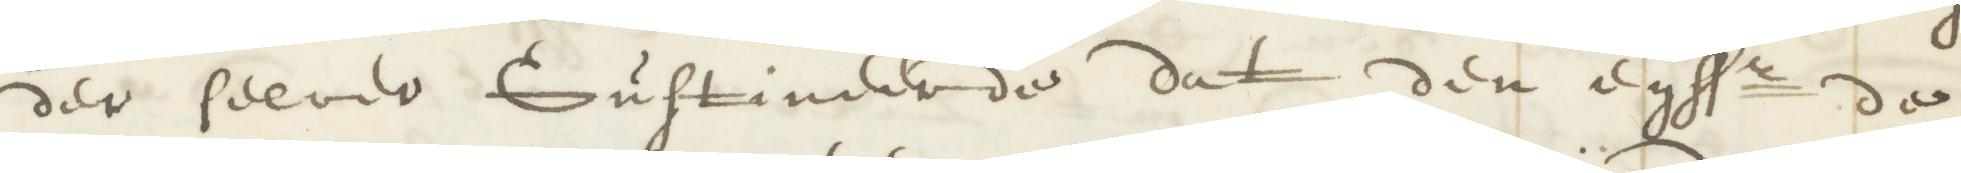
der selver Sustineerde dat den eijss=r de
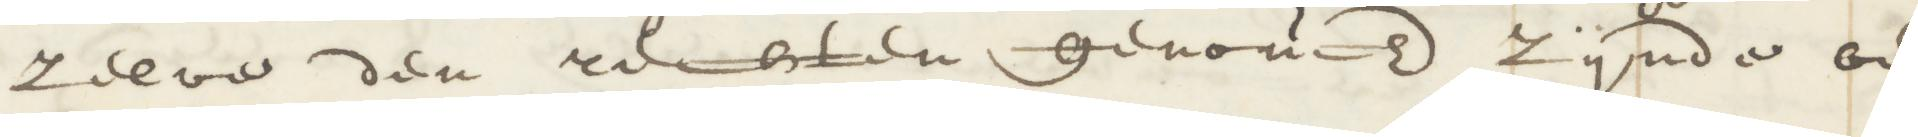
zelve der rechten genouch zijnde be
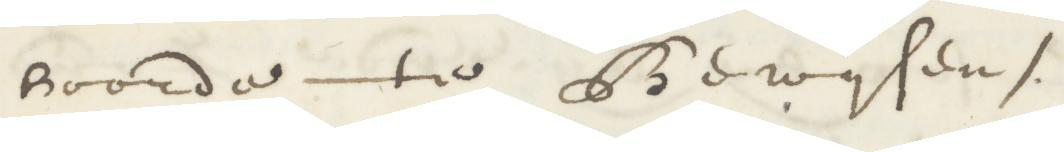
hoorde te Bewijsen/.
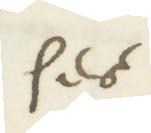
ses
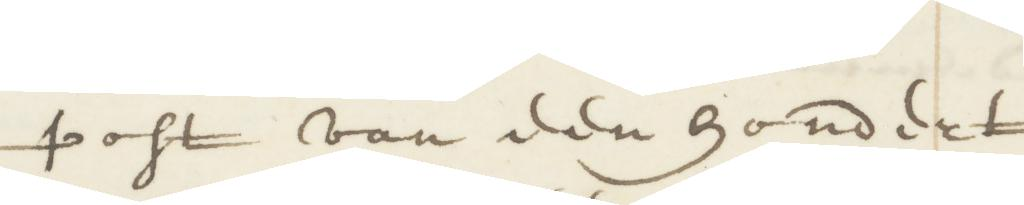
post van een hondert
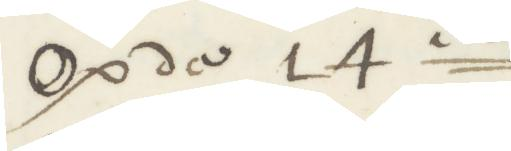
Op de 14=en
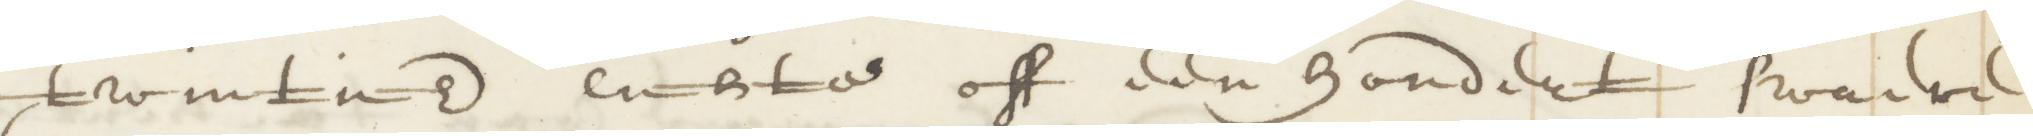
twintich lichte off een hondert swaere
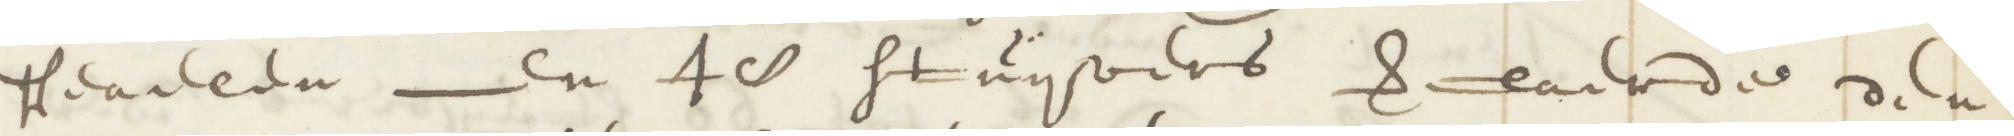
Reaelen en 48 stuijvers verclaerde den
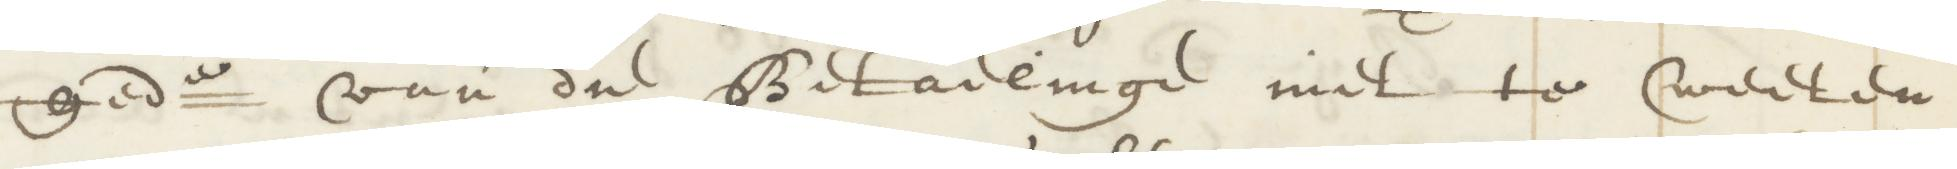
ged=e van die Betaelinge niet te weeten
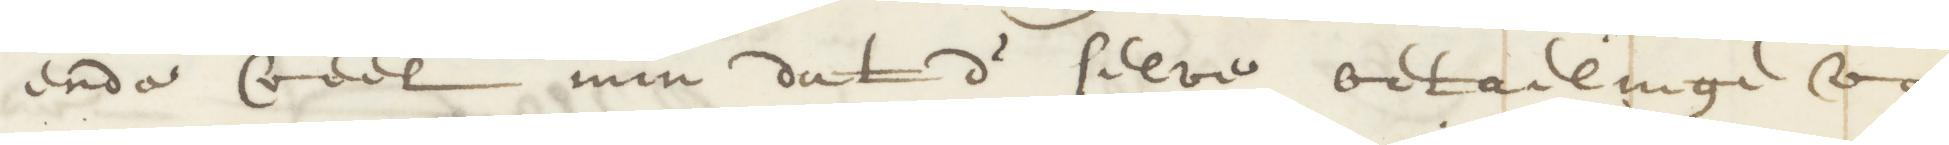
ende veel min dat d’ selve betaelinge vo
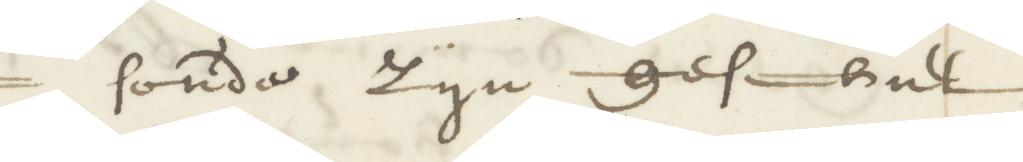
= soude zijn geschiet
